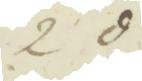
2: d
